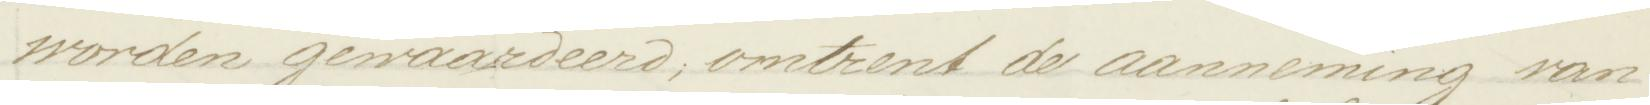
worden gewaardeerd; omtrent de aanneming van
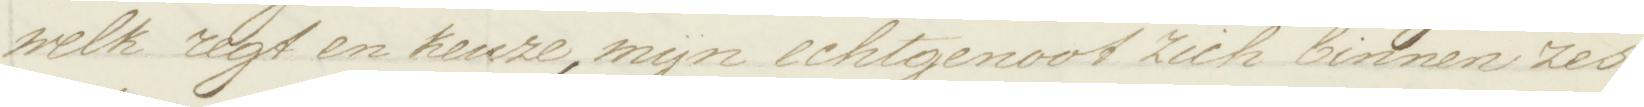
welk regt en keuze, mijn echtgenoot zich binnen zes
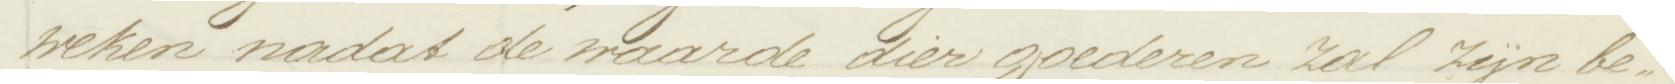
weken nadat de waarde dier goederen zal zijn be„
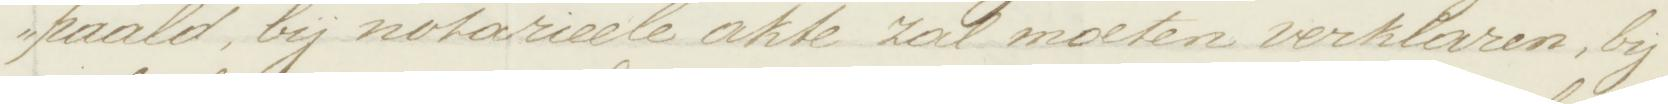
„paald, bij notarieele akte zal moeten verklaren, bij
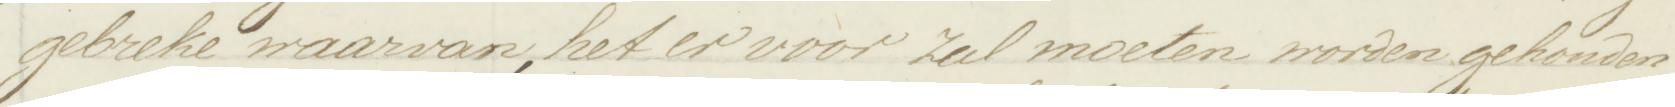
gebreke waarvan, het er voor zal moeten worden gehouden
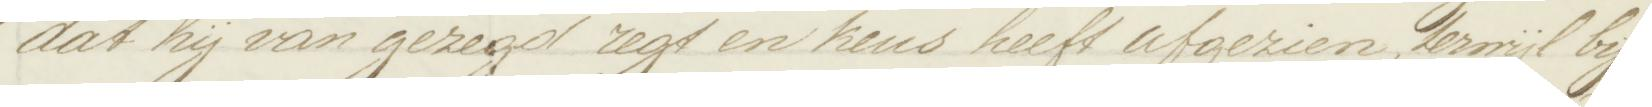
dat hij van gezegd regt en keus heeft afgezien terwijl bij
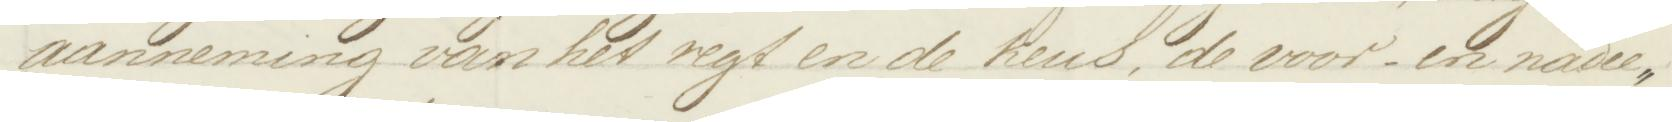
aanneming van het regt en de keus, de voor- en nadee„
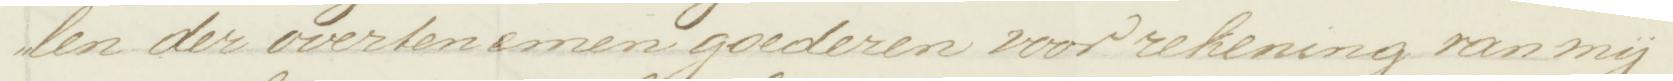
„len der overtenemen goederen voor rekening van mij
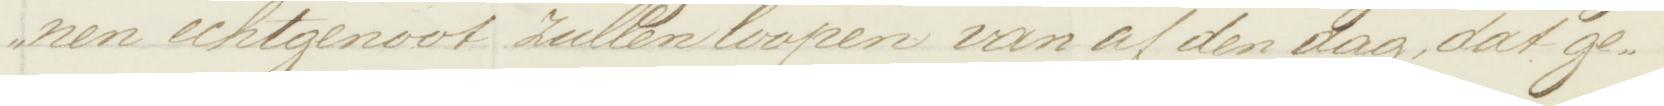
„nen echtgenoot zullen loopen van af den dag, dat ge„
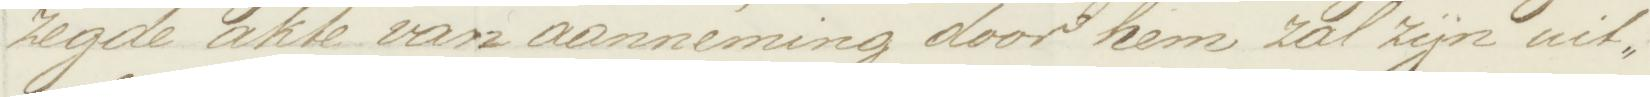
zegde akte van aanneming door hem zal zijn uit„
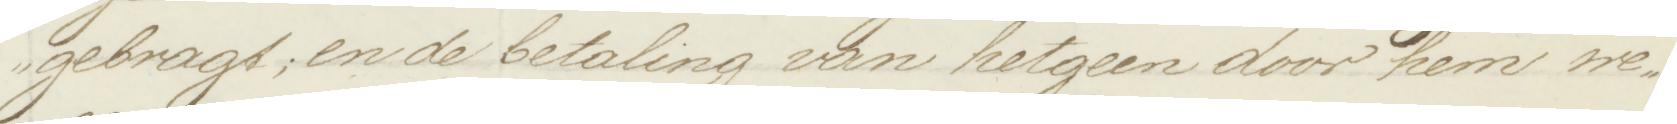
„gebragt, en de betaling van hetgeen door hem we„
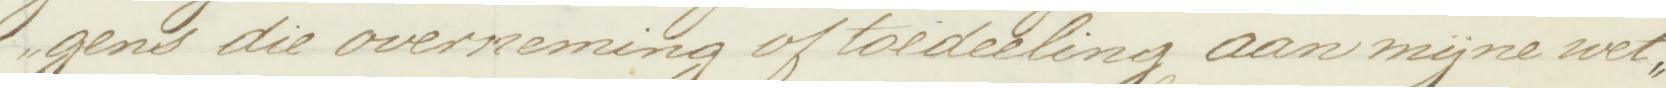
„gens die overneming of toedeeling aan mijne wet„
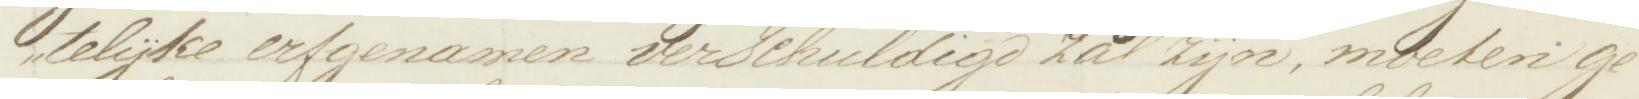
„telijke erfgenamen verschuldigd zal zijn, moeten ge
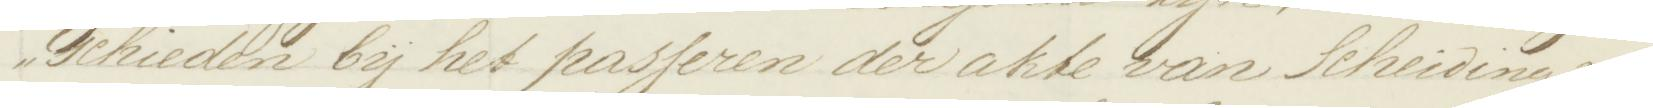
„schieden bij het passeren der akte van Scheiding mij„
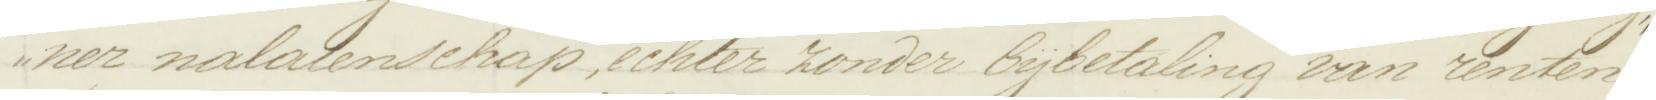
„ner nalatenschap, echter zonder bijbetaling van renten
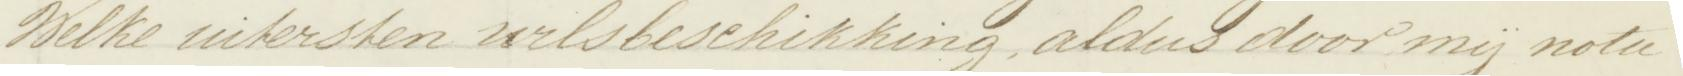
Welke uitersten wilsbeschikking, aldus door mij nota
